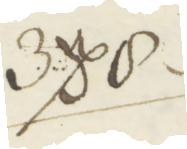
378.
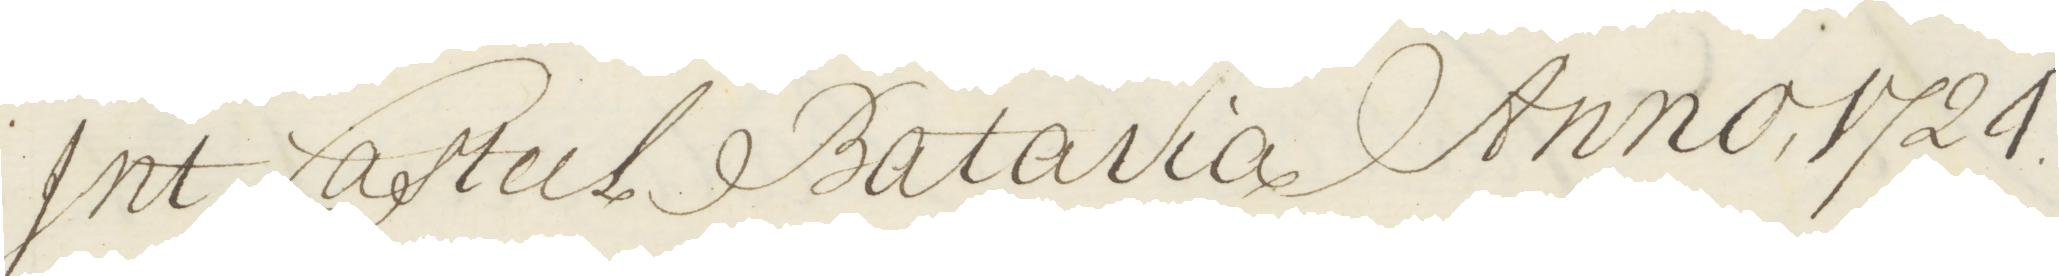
Int Casteel Batavia Anno, 1724.
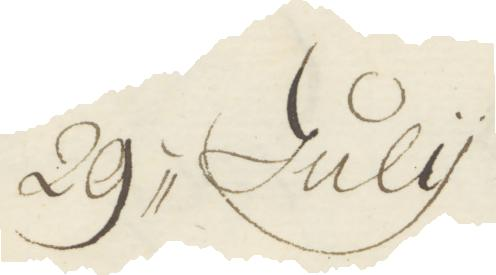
29„' Julij
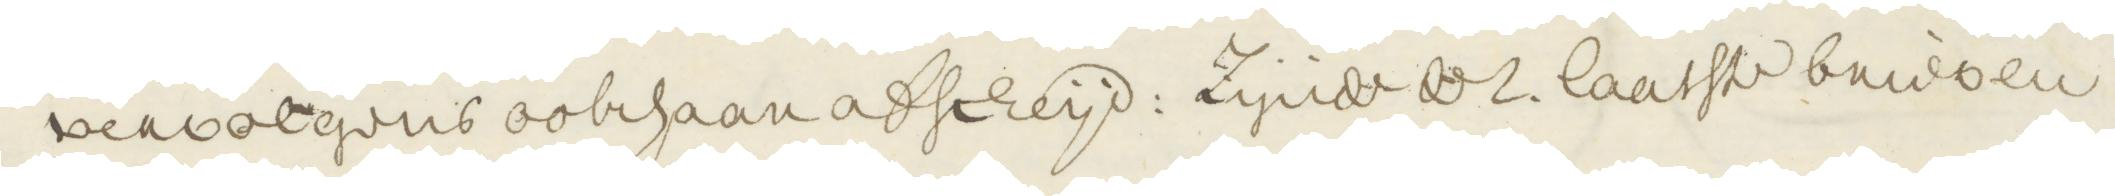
vervolgens ook haar afscheijd: Zijnde de 2. laatste brieven
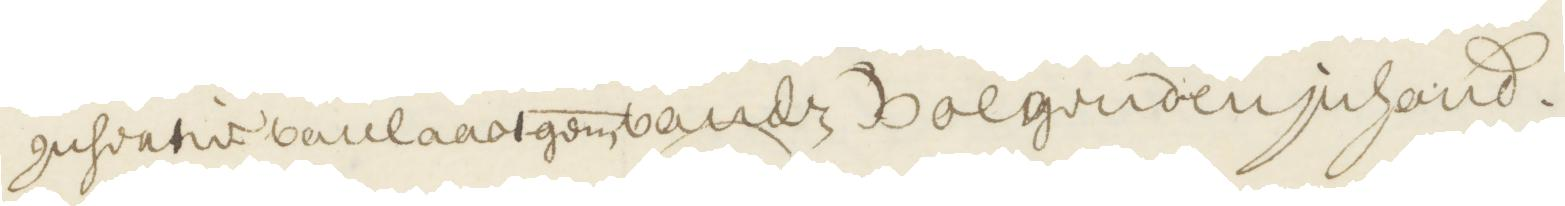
Jnsertie van laast gem vanden volgenden jnhoud.
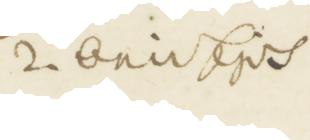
2. briefjes
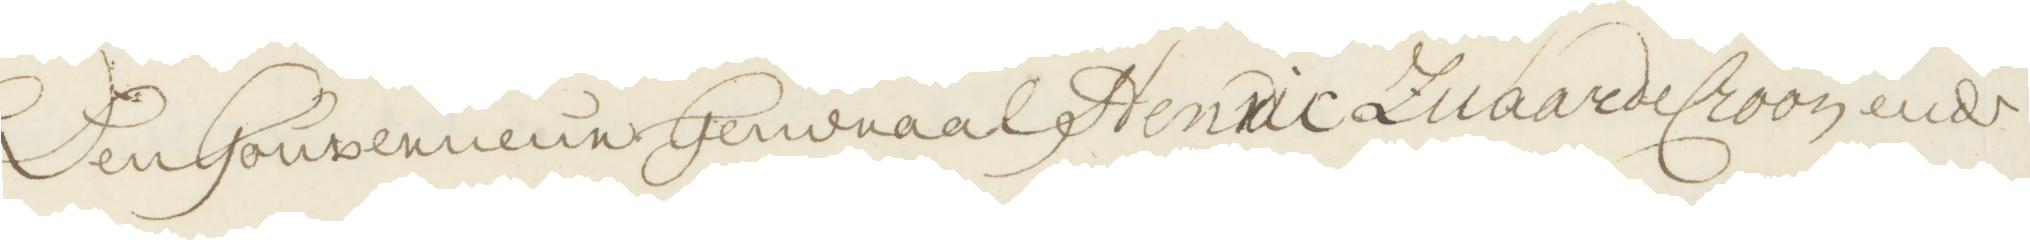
Den Gouverneur Generaal Henric Zuaardecroon ende
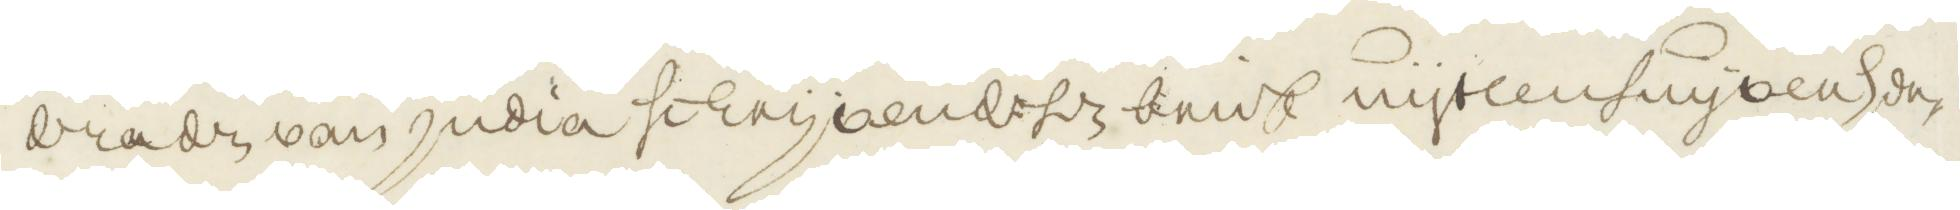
de raden van Jndia schrijven desen brief uijt een suijver her„
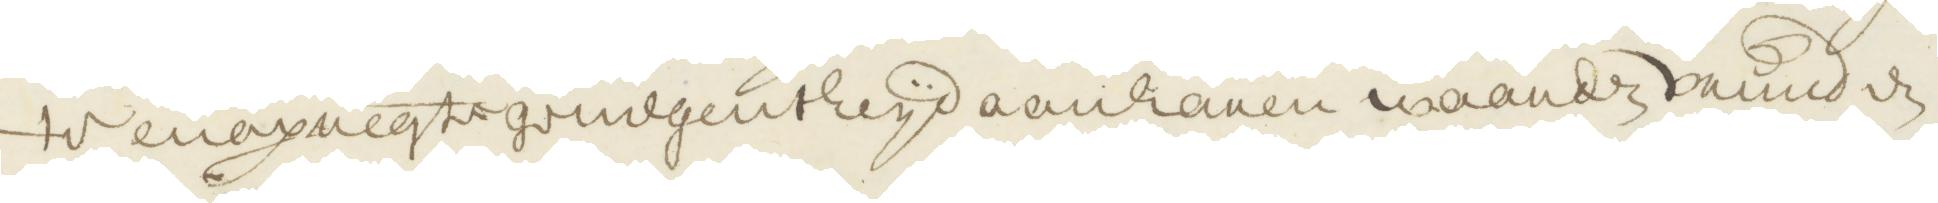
te en opregte genegentheijd aan haren waarden vrund en
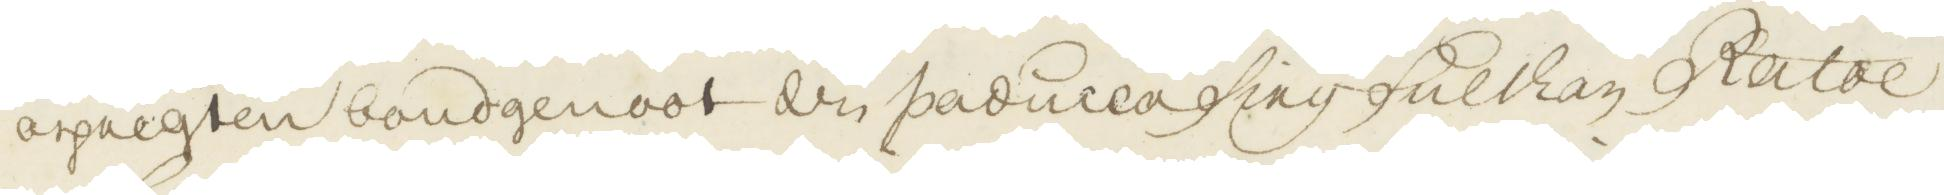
opregten bondgenoot den paducca sirij sulthan Ratoe
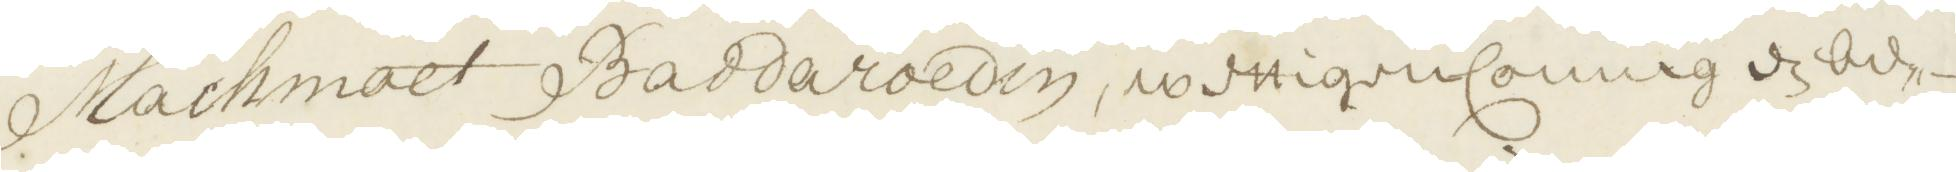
Machmoet Baddaroedin, wettigen Coning en be„
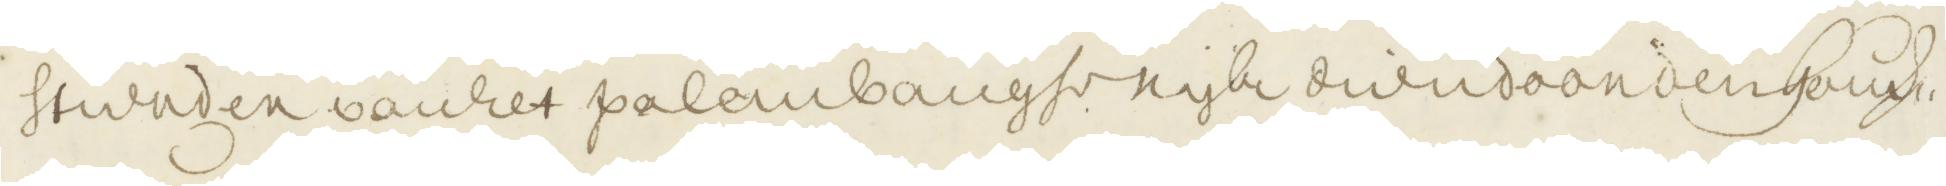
stierder van het palembangse rijk dien door den Gouver„
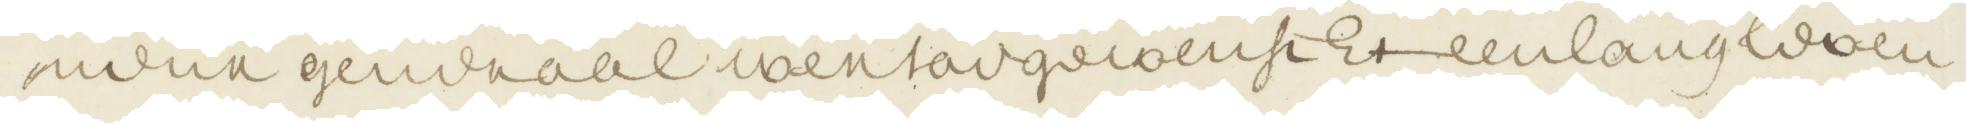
neur generaal wer toegewenscht een lang leven
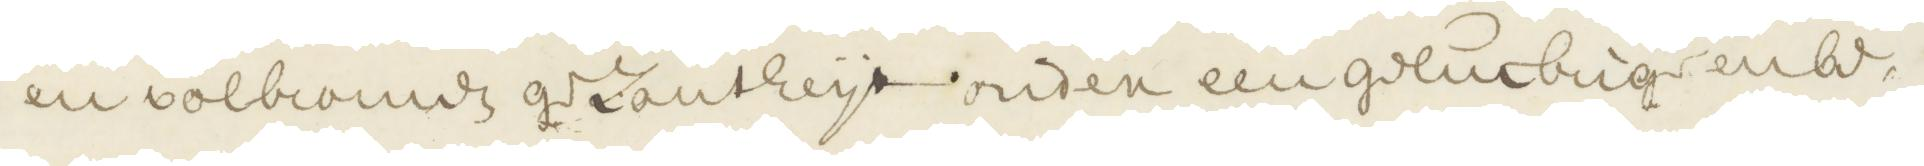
en volkomen gezontheijt onder een geluckige en be„
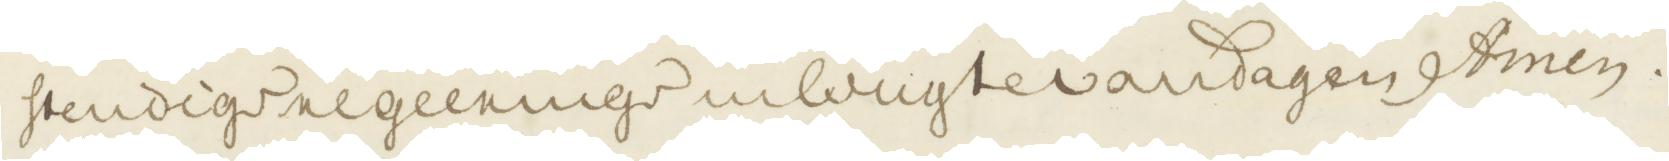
stendige regeeringe in lengte van dagen Amen.
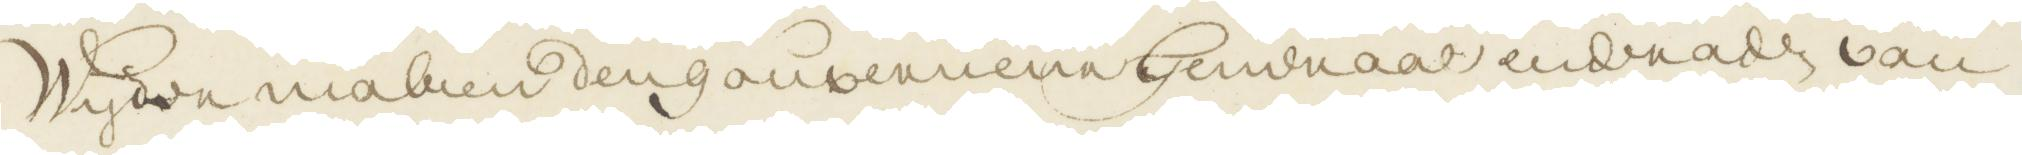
Wijder maken den gouverneur Generaal en de raden van
